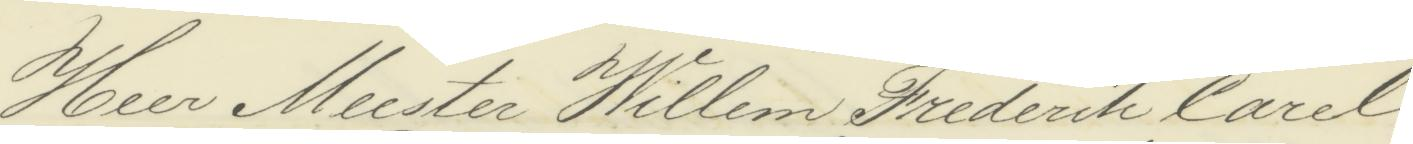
Heer Meester Willem Frederik Carel
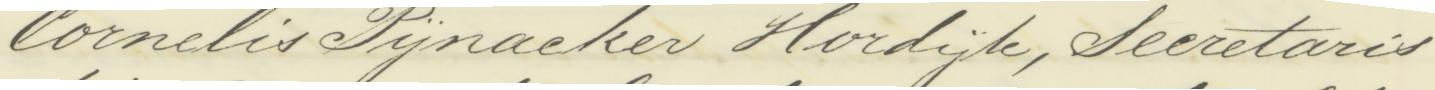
Cornelis Pijnacker Hordijk, Secretaris
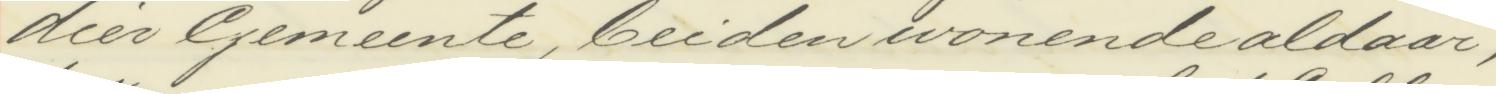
dier Gemeente, beiden wonende aldaar,
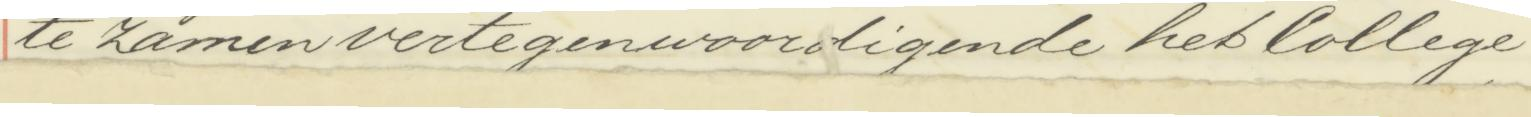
te zamen vertegenwoordigende het College
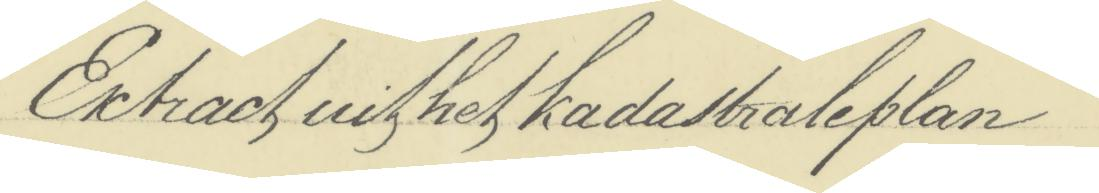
Extract uit het kadastraleplan
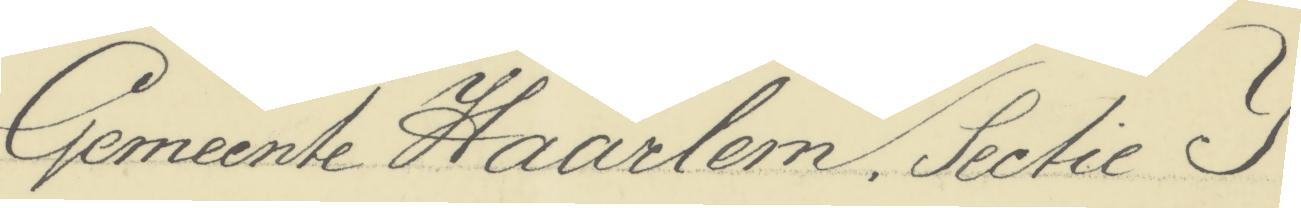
Gemeente Haarlem, sectie I.
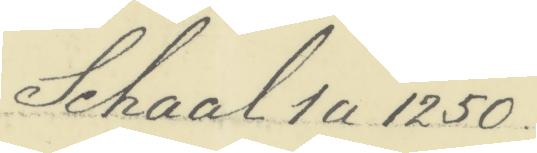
Schaal 1a 1250.
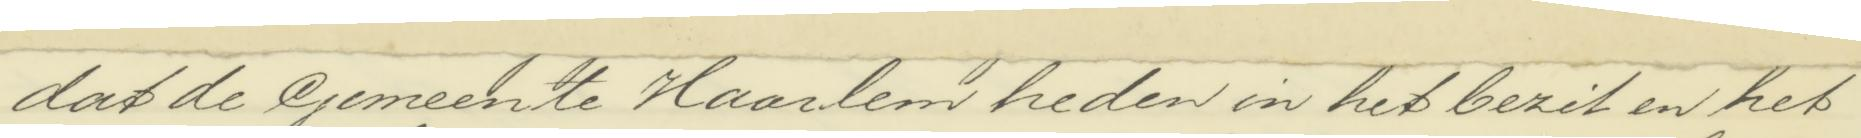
dat de Gemeente Haarlem heden in het bezit en het
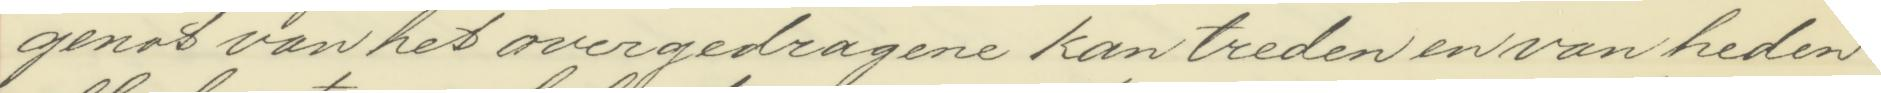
genot van het overgedragene kan treden en van heden
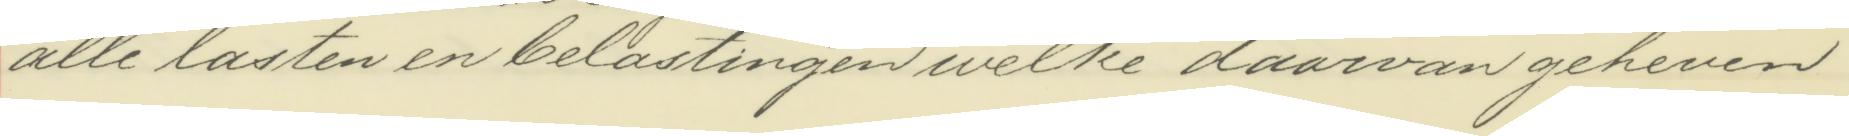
alle lasten en belastingen welke daarvan geheven
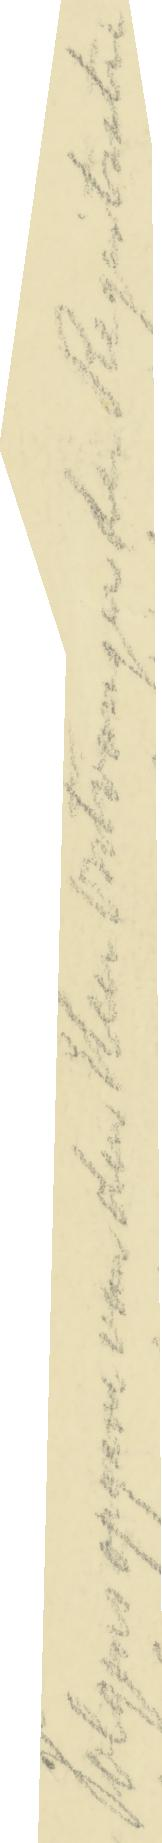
volgens opgave van den Heer Ontvanger der Registratie
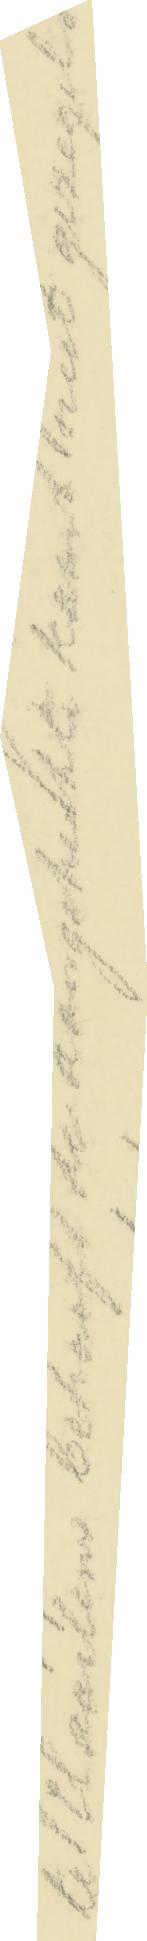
te Haarlem behoeft de aangehechte kaart niet gezegeld
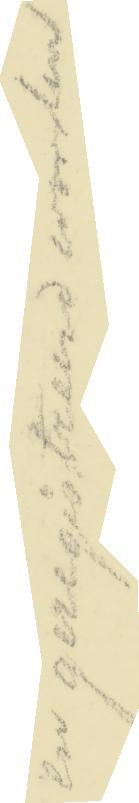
en geregistreerd worden
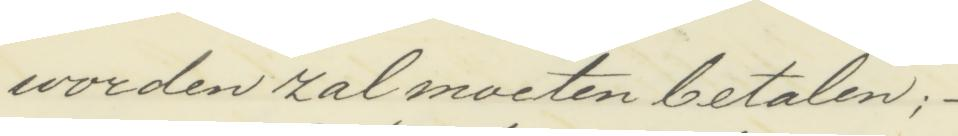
worden zal moeten betalen:
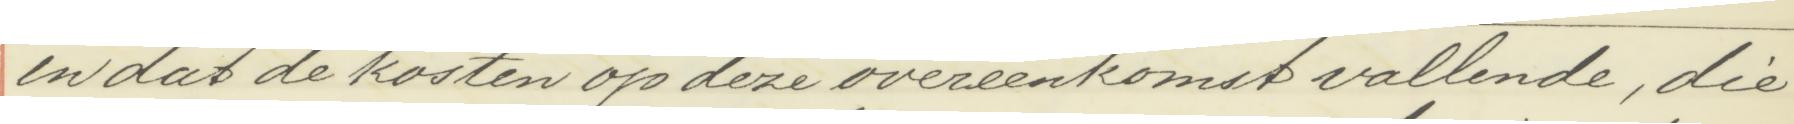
in dat de kosten op deze overeenkomst vallende, die
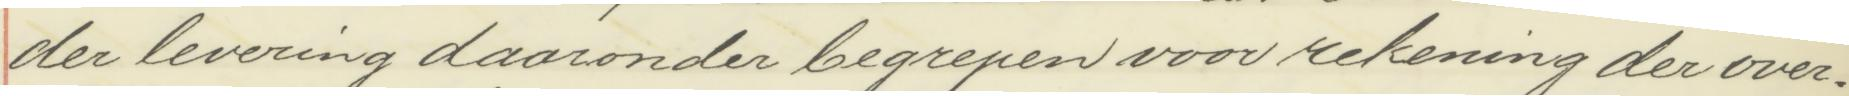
der levering daaronder begrepen voor rekening der over-
